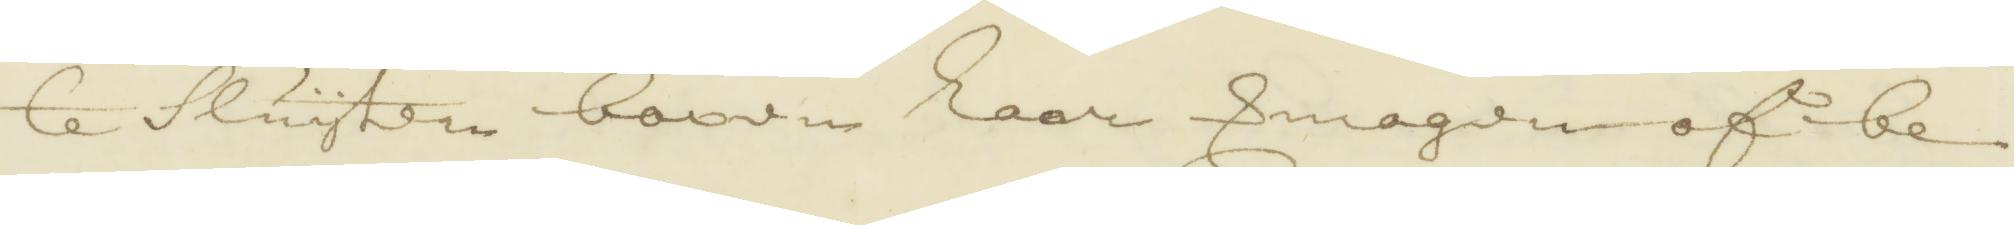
te sluijten boven haar vermogen of be
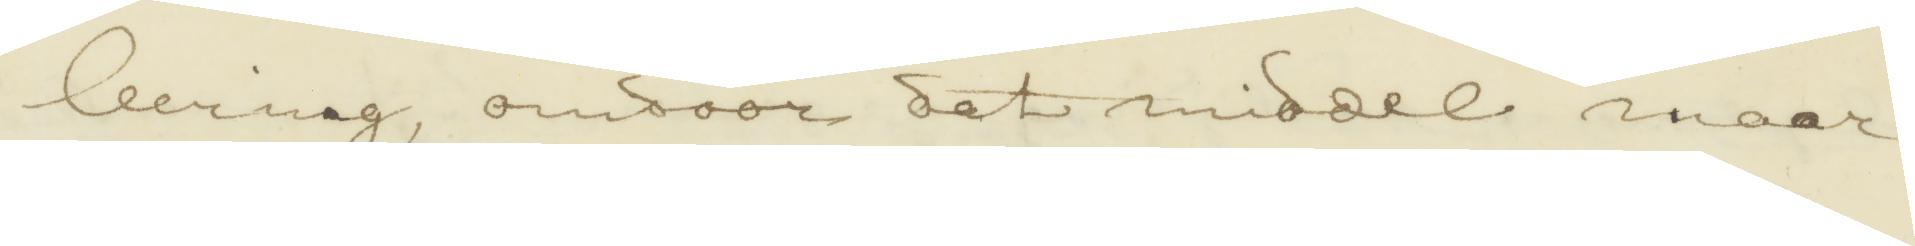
leering, omdoor dat middel maar
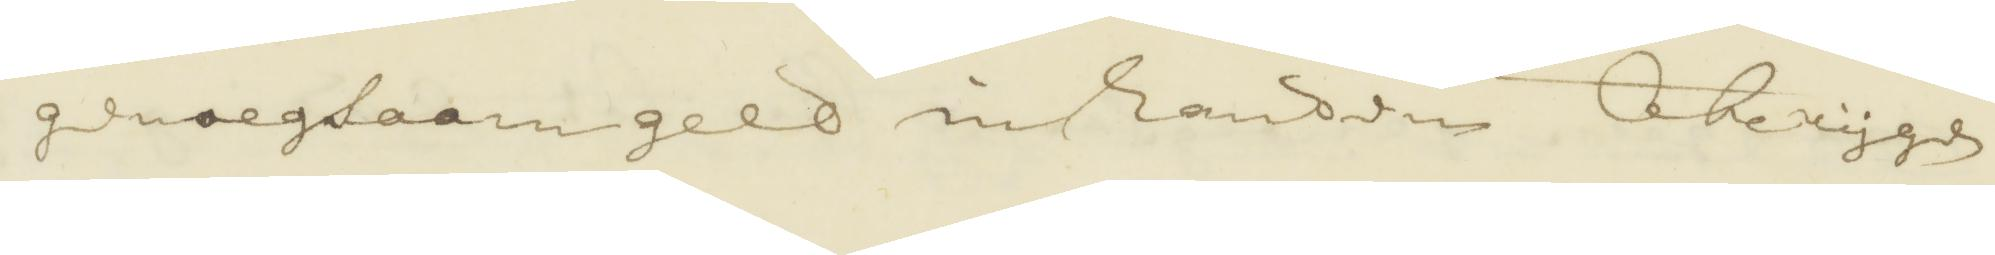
genoegsaam geld in handen tekrijgen
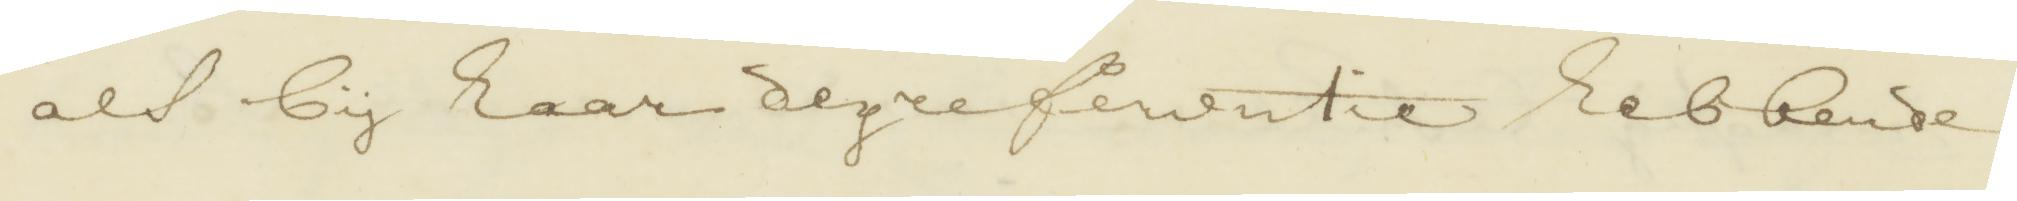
als bij haar de preferentie hebbende
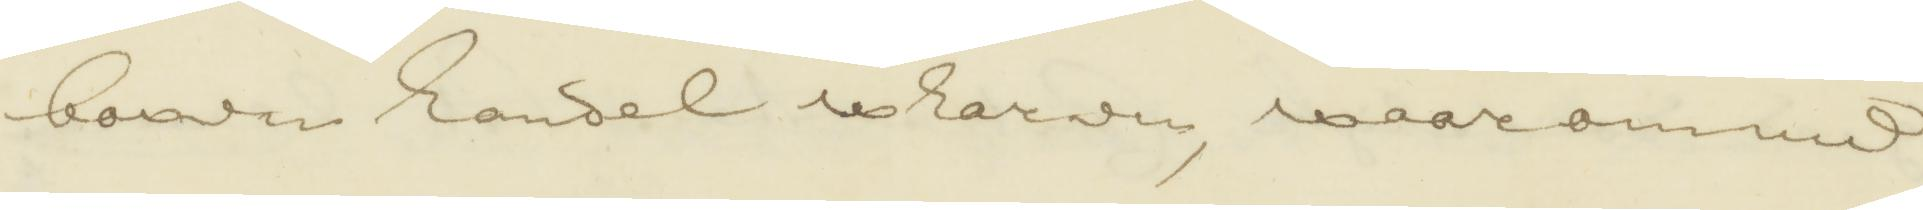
boven handel wharen, waaromme
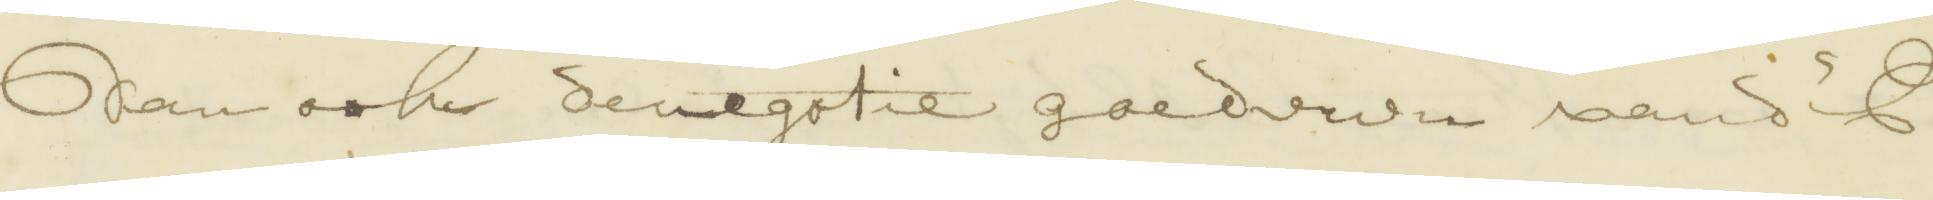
dan ook denegotie goederen van d’E
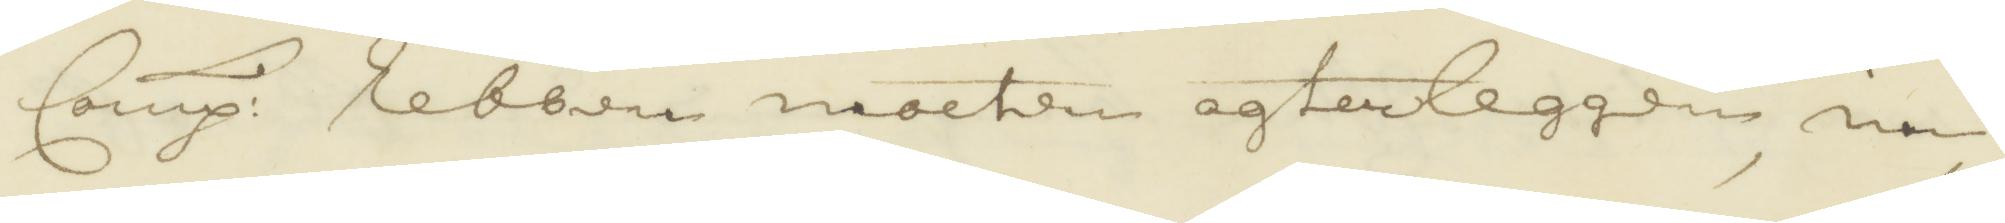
Comp: hebben moeten agterleggen, im„
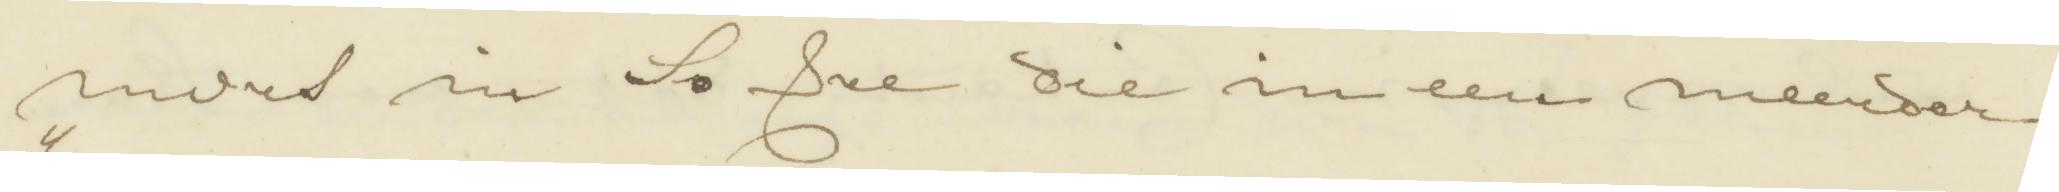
„mers in so verre die in een meerder
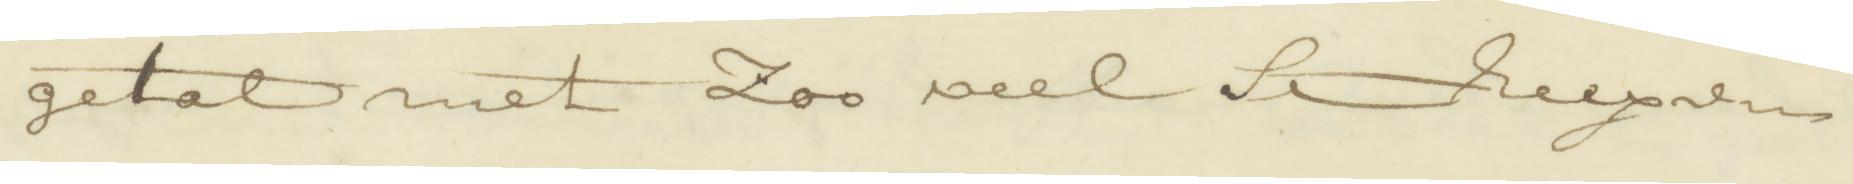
getal met zoo veel scheepen
